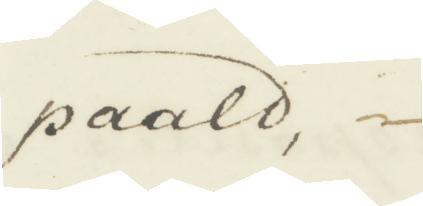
paald, —
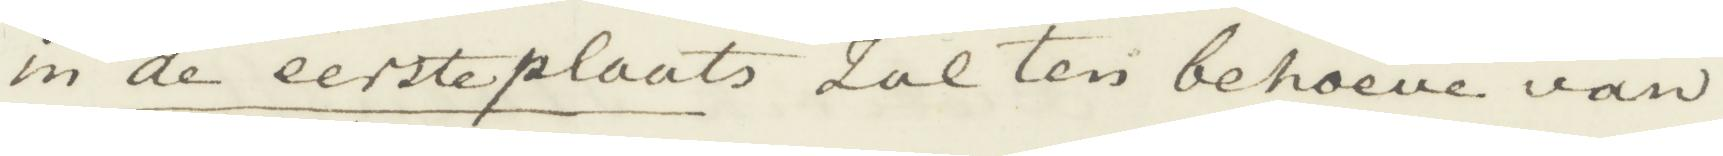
in de eerste plaats zal ten behoeve van
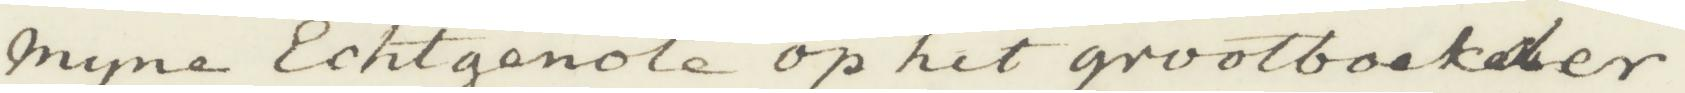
myne Echtgenote op het grootboek der
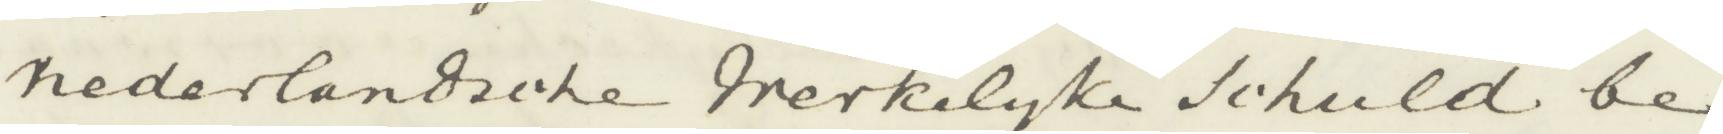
nederlandsche Werkelyke schuld be
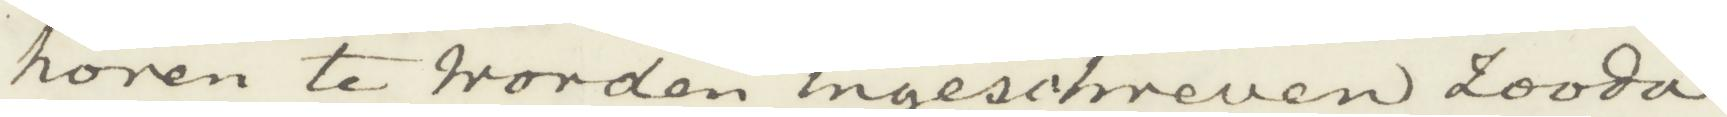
horen te worden ingeschreven zooda
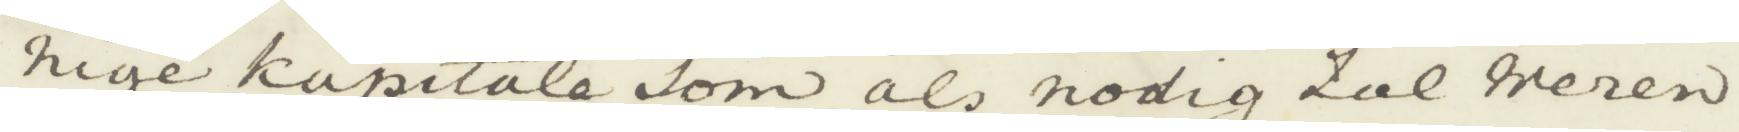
nige kapitale som, als nodig zal wezen
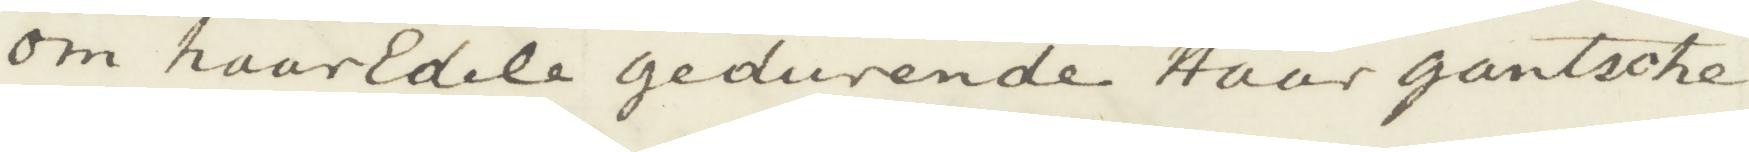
om haar Edele gedurende Haar gantsche
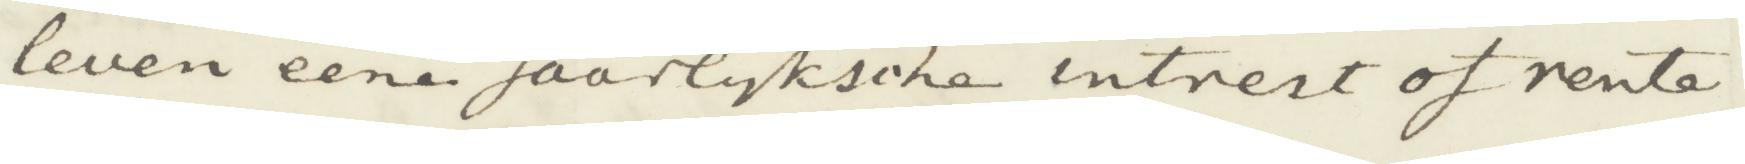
leven eene jaarlyksche intrest of rente
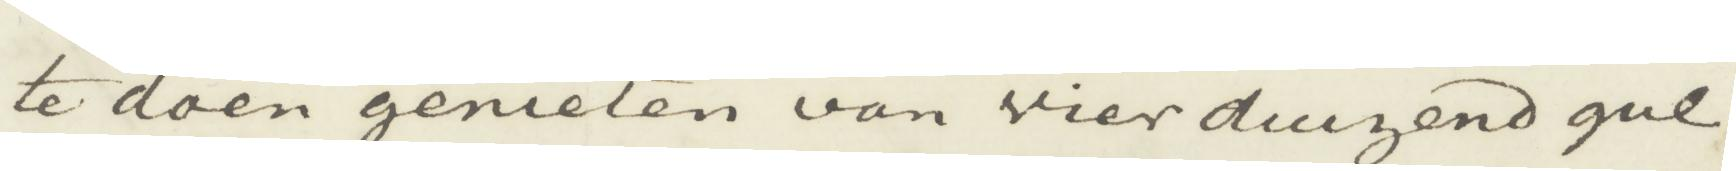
te doen genieten van vier duizend gul
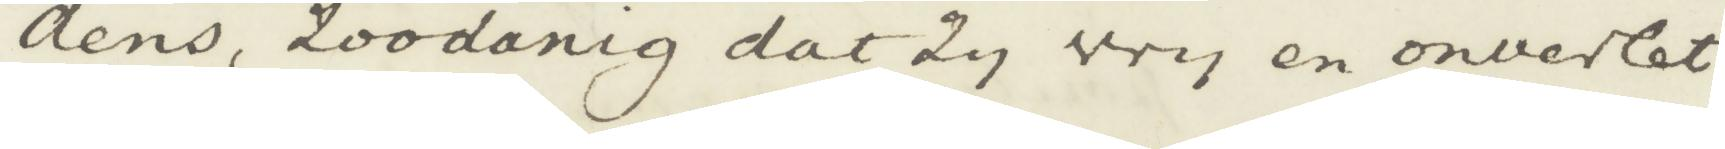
dens, zoodanig dat zy vry en onverlet
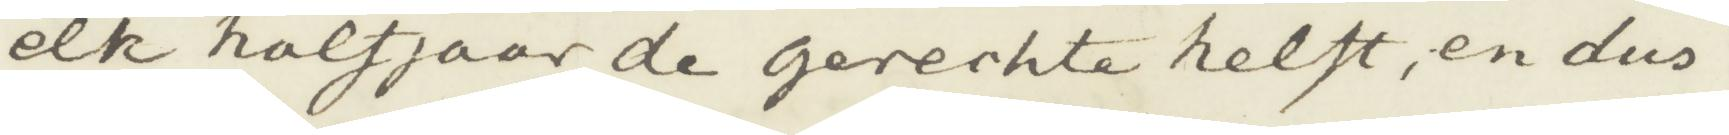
elk halfjaar de gerechte helft, en dus
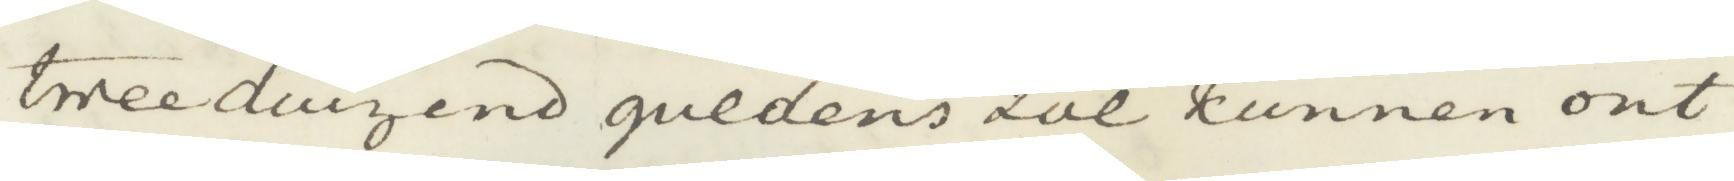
twee duizend guldens zal kunnen ont
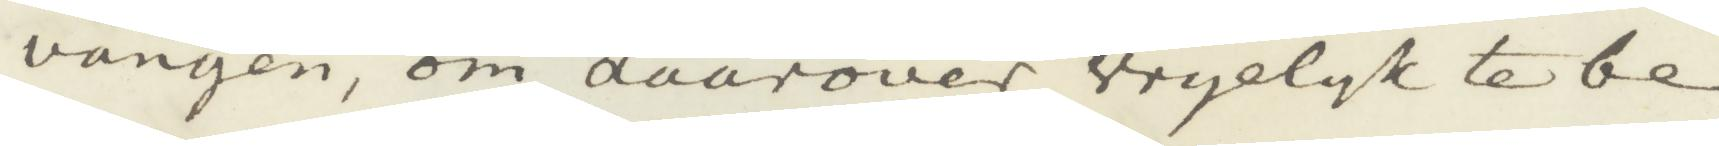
vangen, om daarover vryelyk te be
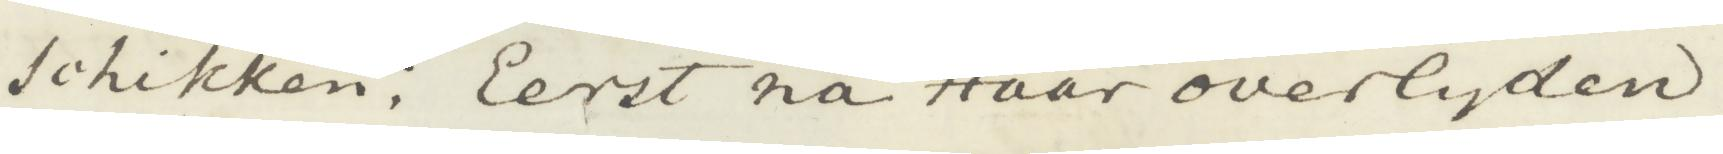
schikken; Eerst na Haar overlyden
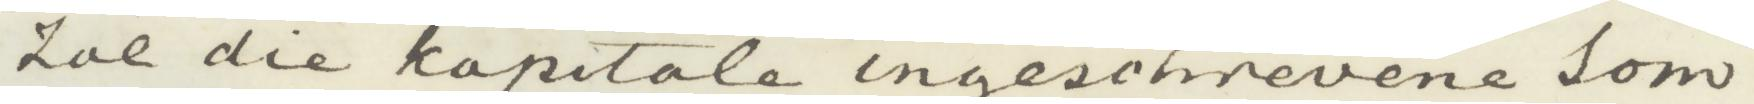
zal die kapitale ingeschrevene som
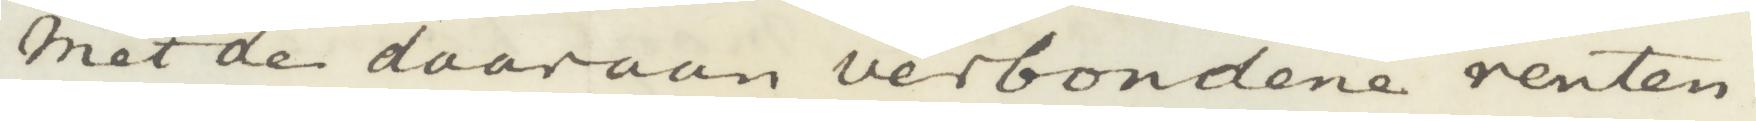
met de daaraan verbondene venten
